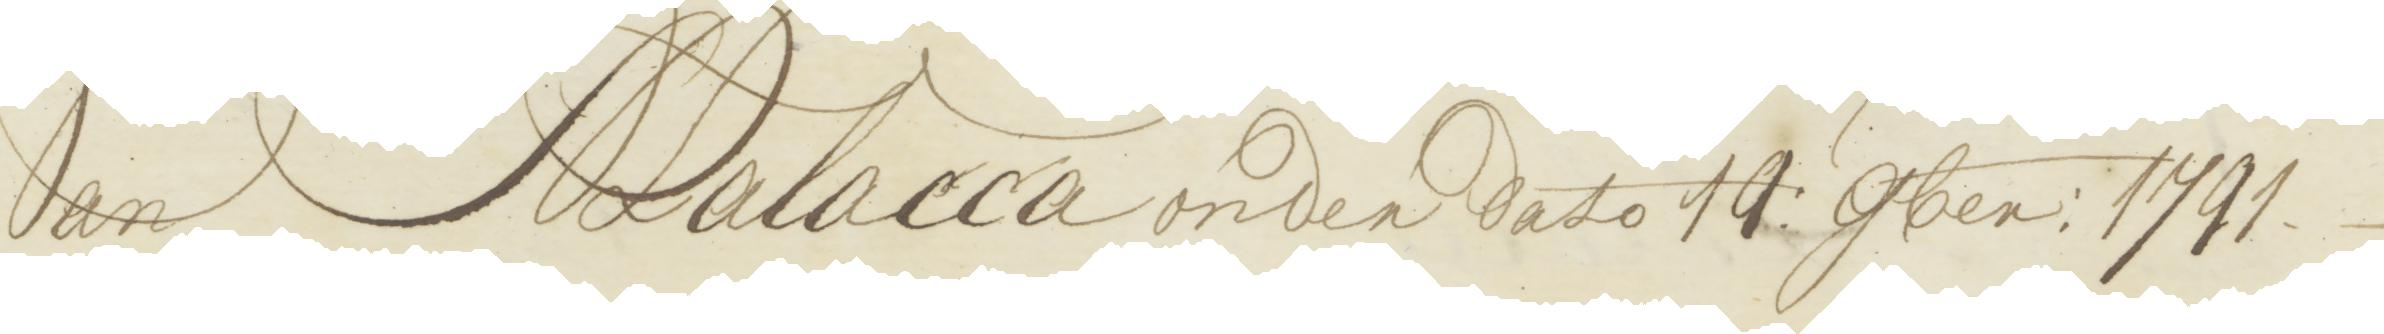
Van Malacca onder dato 19: 9ber: 1741.
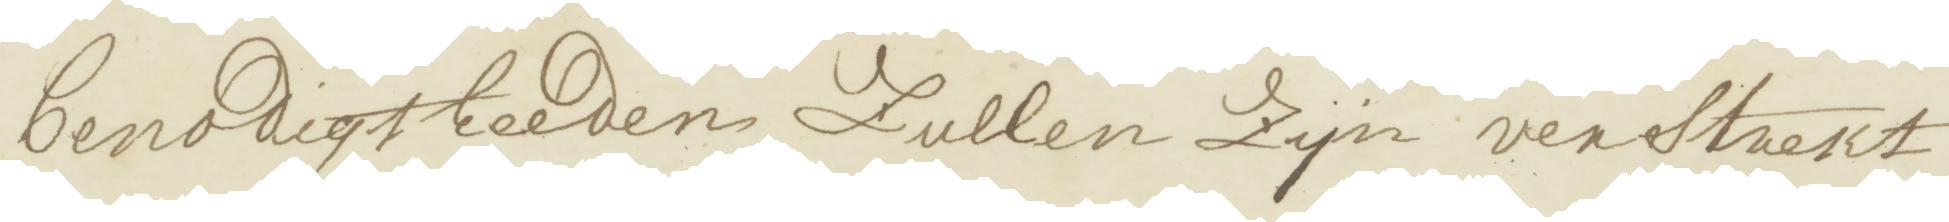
benodigtheeden zullen zijn verstrekt
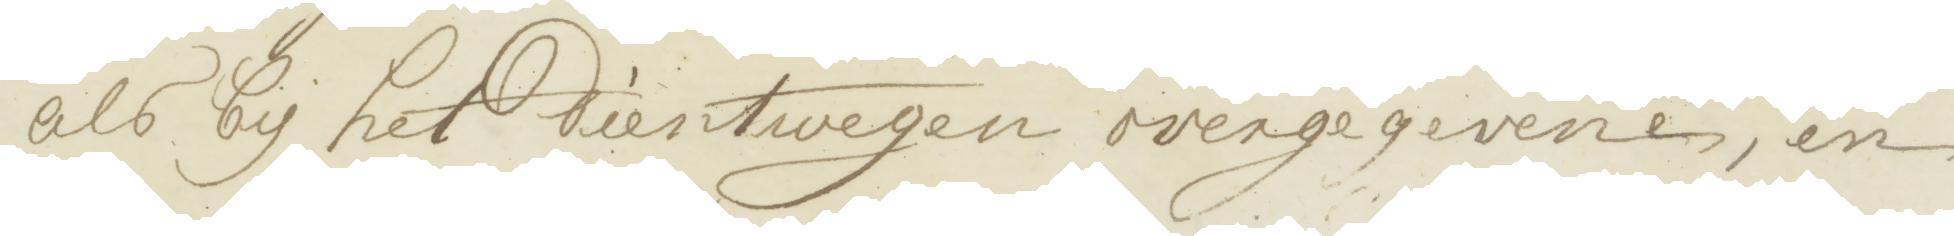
als bij het dientwegen overgegevene, en
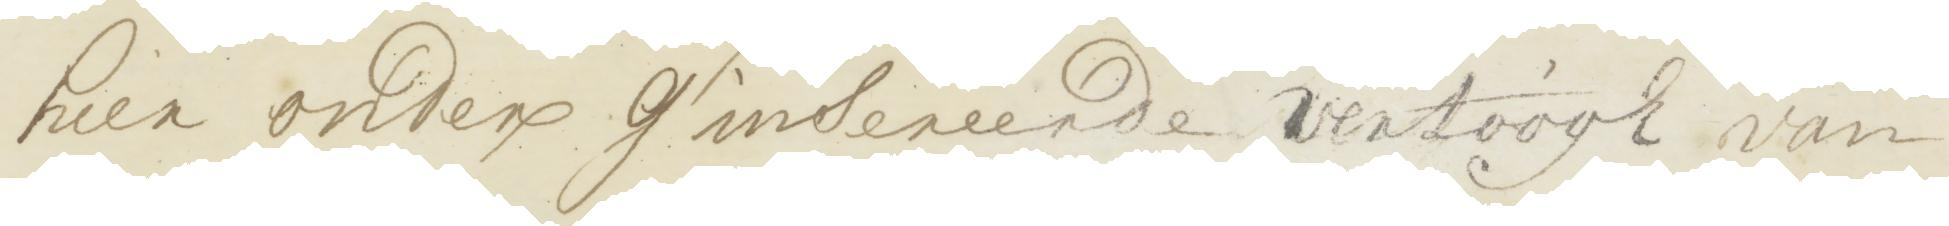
hier onder g'insereerde vertoogh van
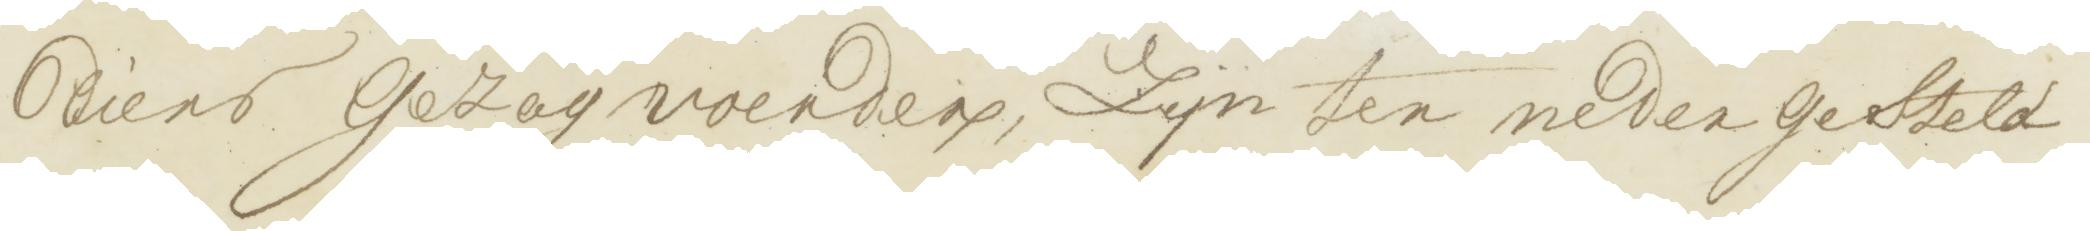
diers gezagvoerder, zijn ter neder gesteld
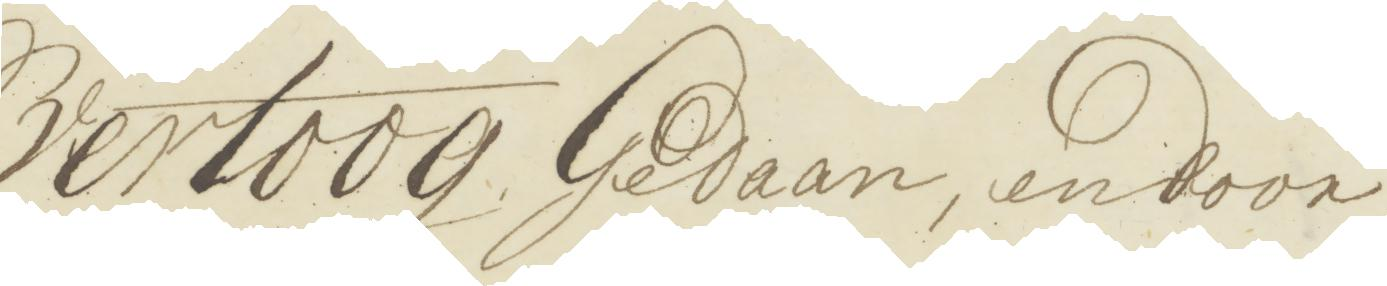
Vertoog, Gedaan, en door
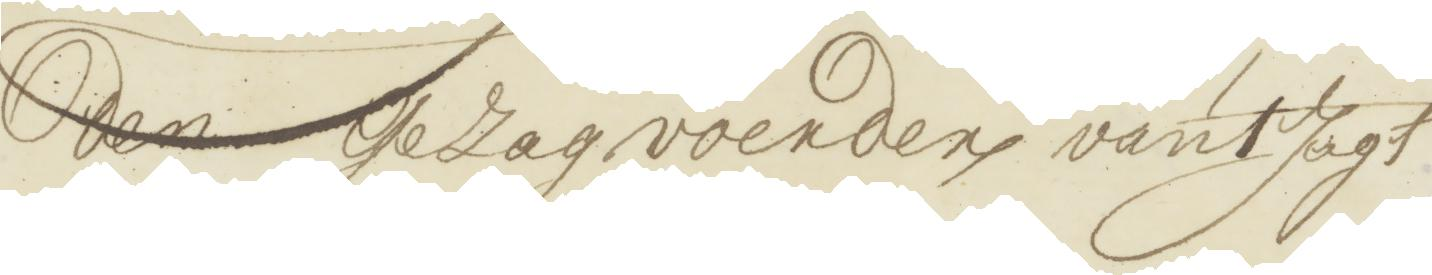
den gezagvoerder van 't Jagt
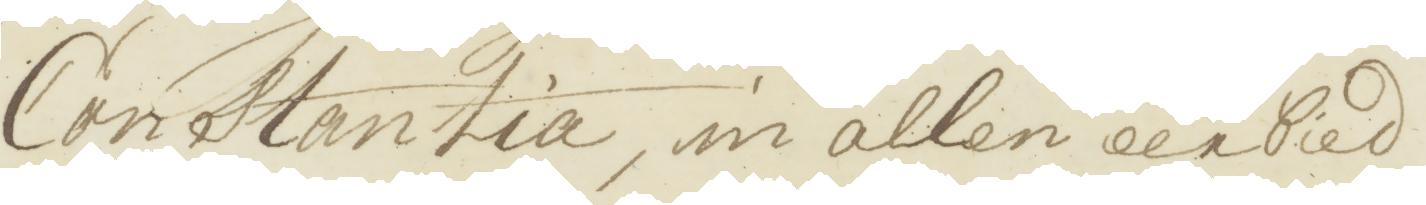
Constantia, in allen eerbied
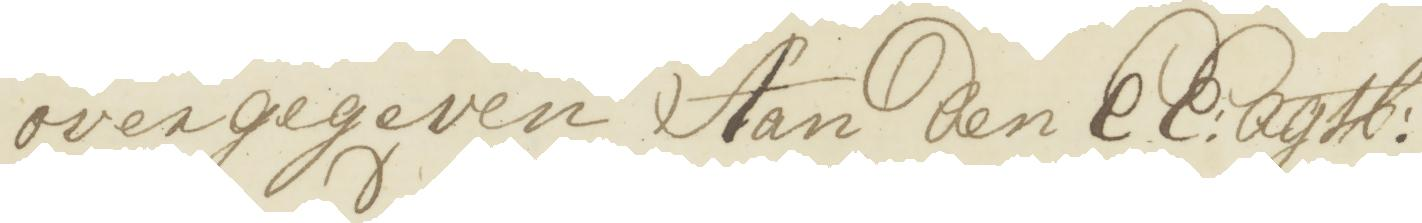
overgegeven Aan den E E: agtb:
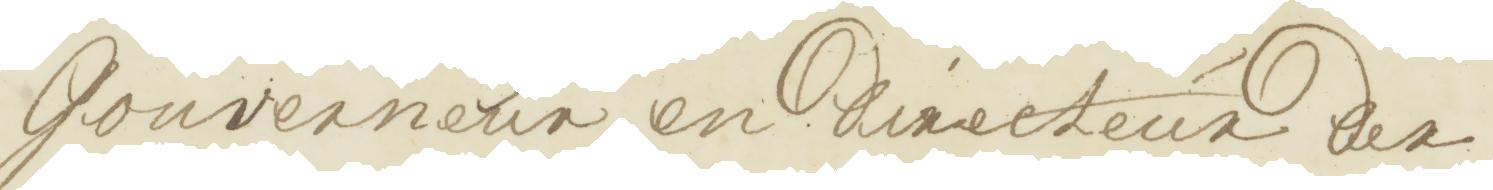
gouverneur en directeur der
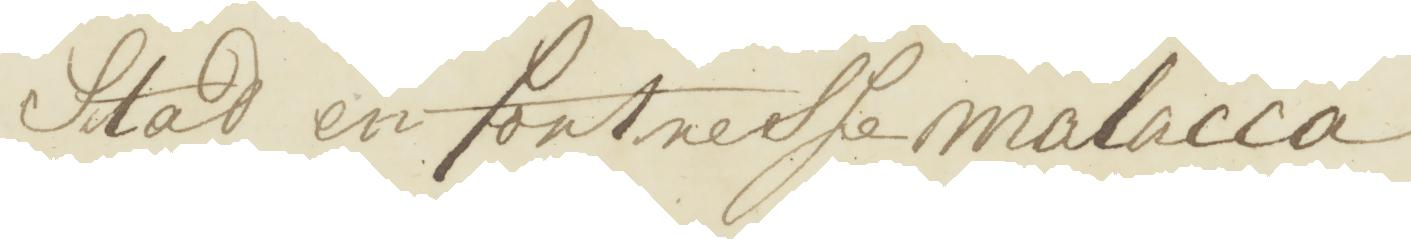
stad en fortresse malacca
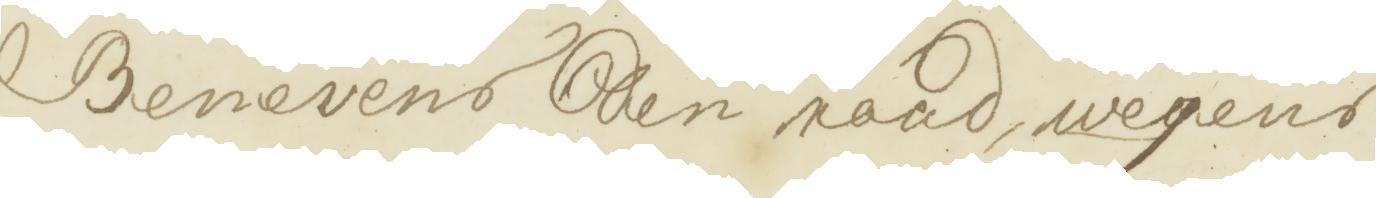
Benevens den raad, wegens
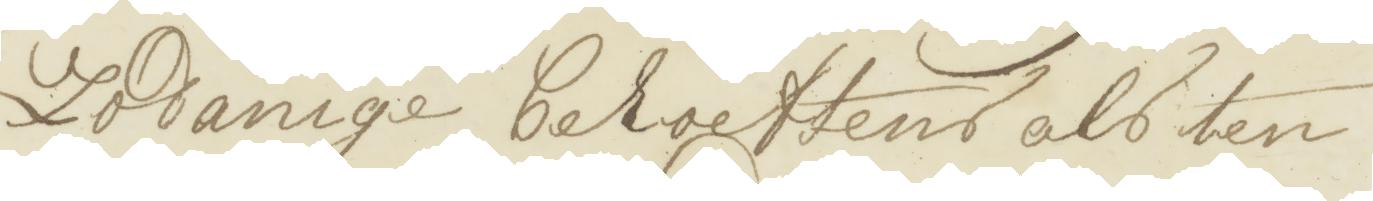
zodanige behoeftens als ten
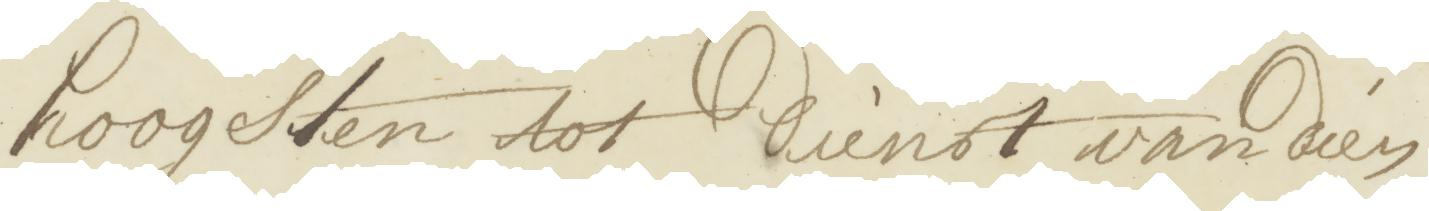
hoogsten tot dienst van dien
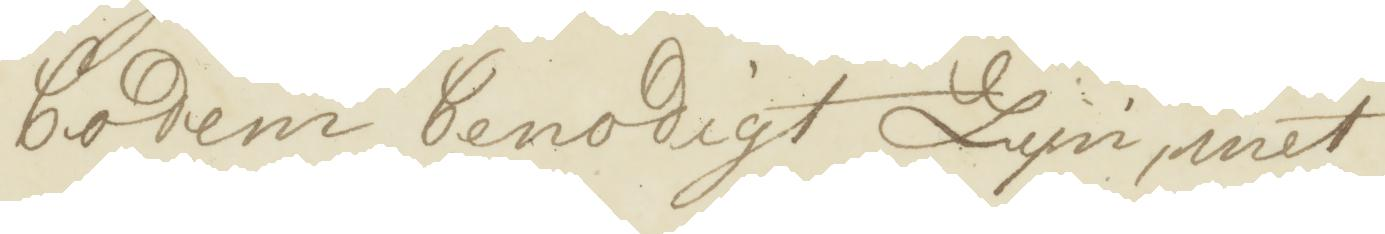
bodem benodigt zijn, met
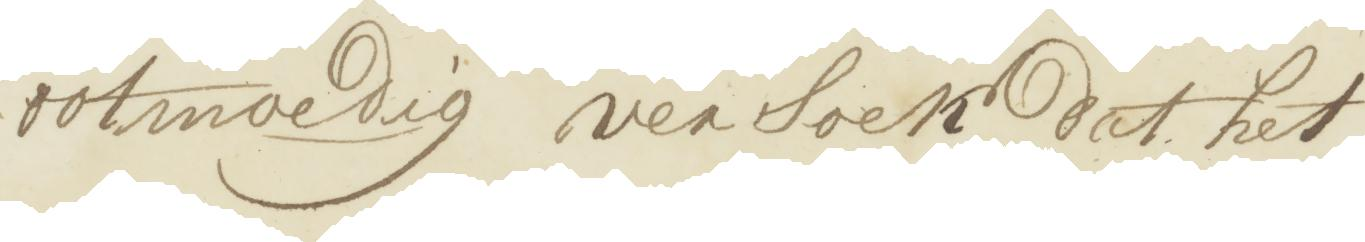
ootmoedig versoek dat het
